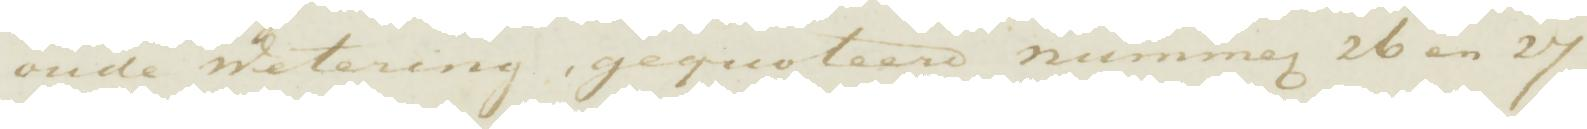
oude wetering, gequoteerd nummer 26 en 27
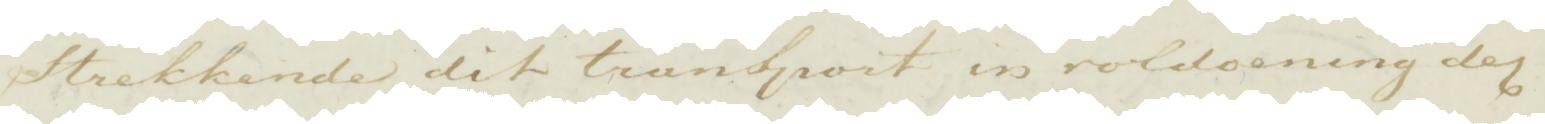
strekkende dit transport in voldoening der
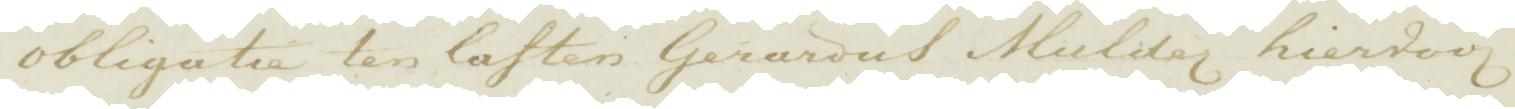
obligatie ten lasten Gerardus Mulder hierdoor
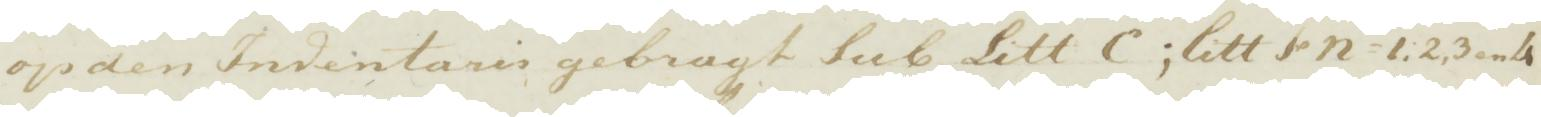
op den Inventaris gebragt sub Litt C; litt T n=o 1:2,3 en 4
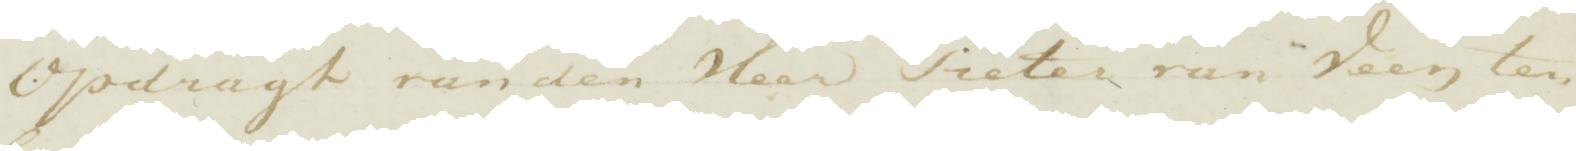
Opdragt van den Heer Pieter van Veen ten
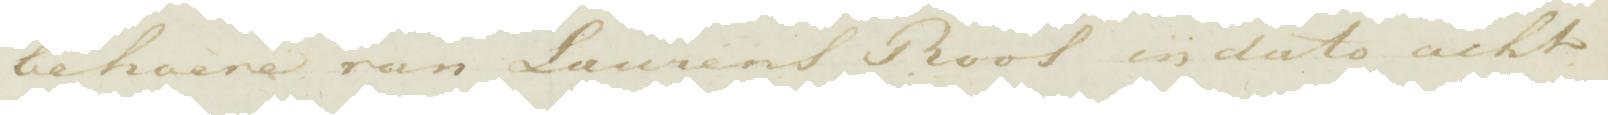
behoeve van Laurens Roos in dato acht
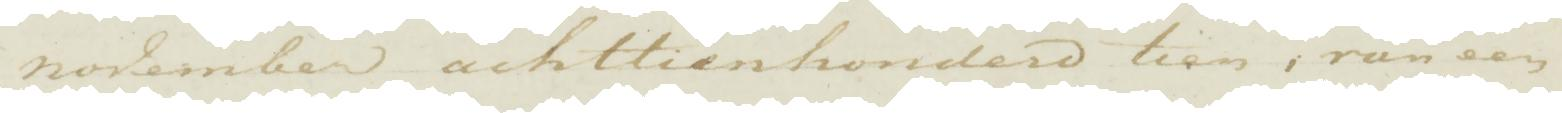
november achttienhonderd tien; van een
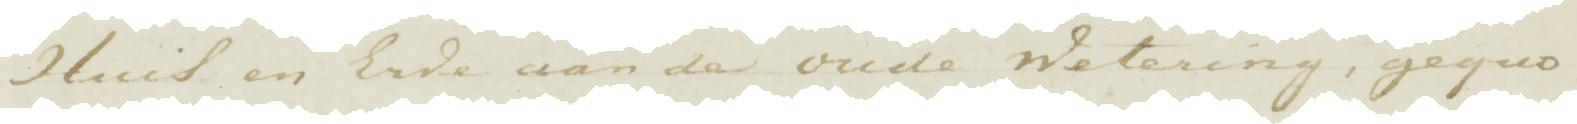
Huis en Erve aan de oude wetering, gequo
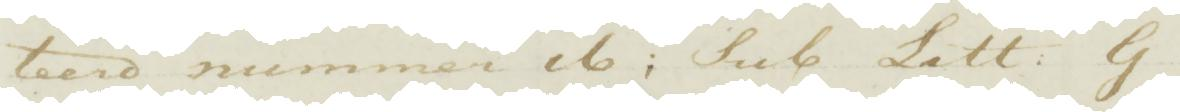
teerd nummer 16; sub Litt: G
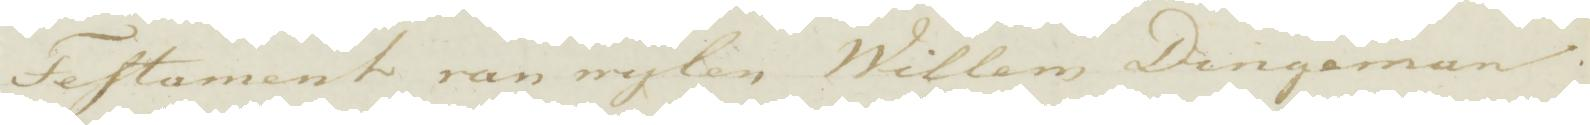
Testament van wylen Willem Dingeman
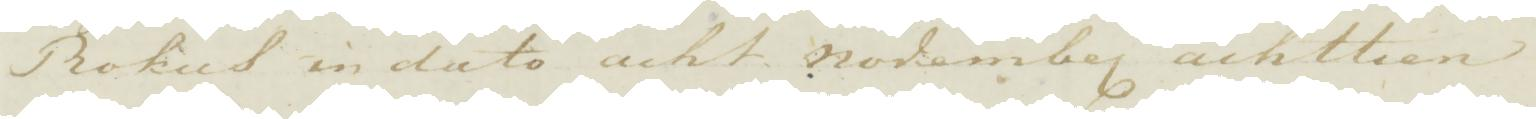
Rokus in dato acht november achttien
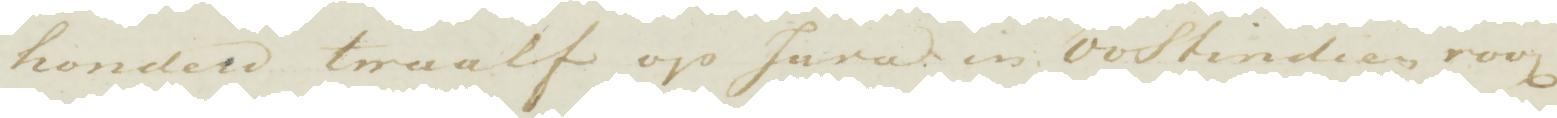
honderd twaalf op Java in Oostindien voor
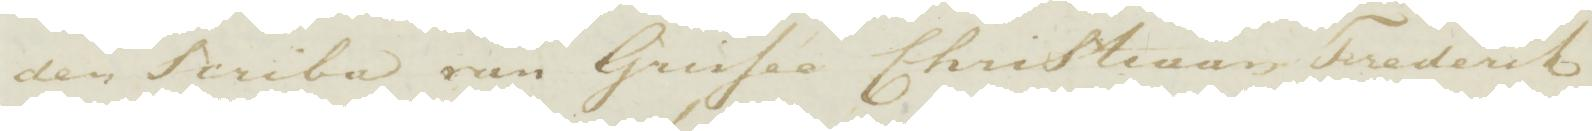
den Scriba van Grissée Christiaan Frederik
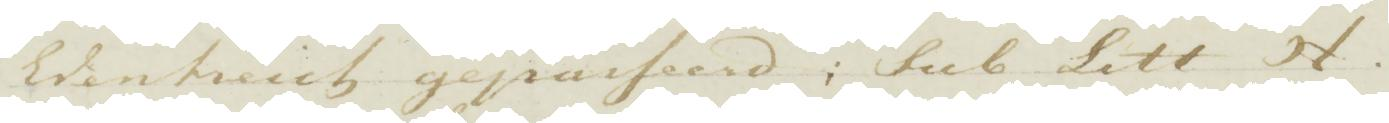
Eventreich gepasseerd; sub Litt H.
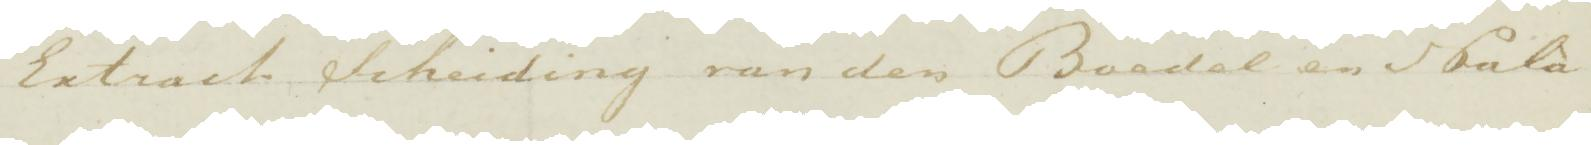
Extract scheiding van den Boedel en Nala
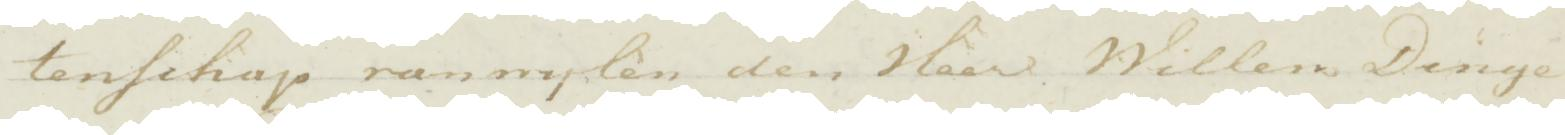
tenschap van wylen den Heer Willem Dinge
